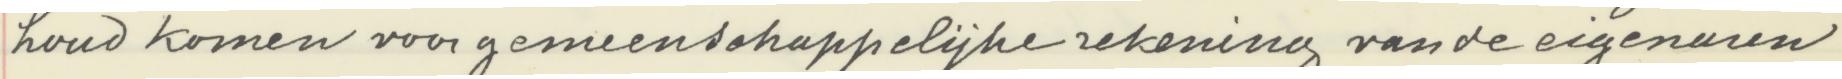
houd komen voor gemeenschappelijke rekening van de eigenaren
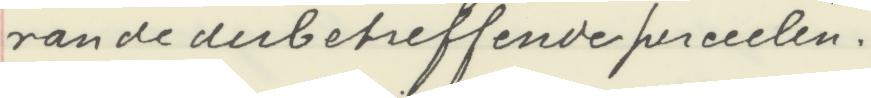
van de desbetreffende perceelen.
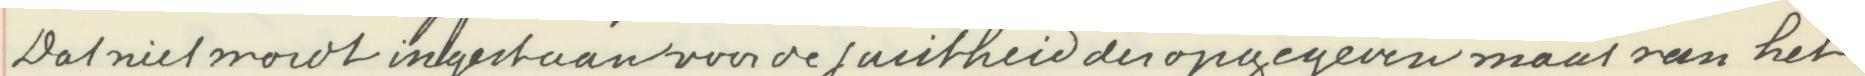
Dat niet wordt ingestaan voor de juistheid der opgegeven maat van het
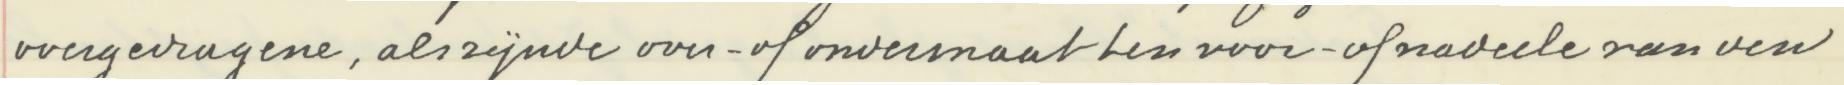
overgedragene, als zijnde over- of ondermaat ten voor- of nadeele van van
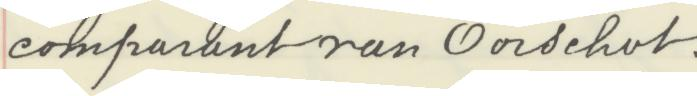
comparant van Oorschot
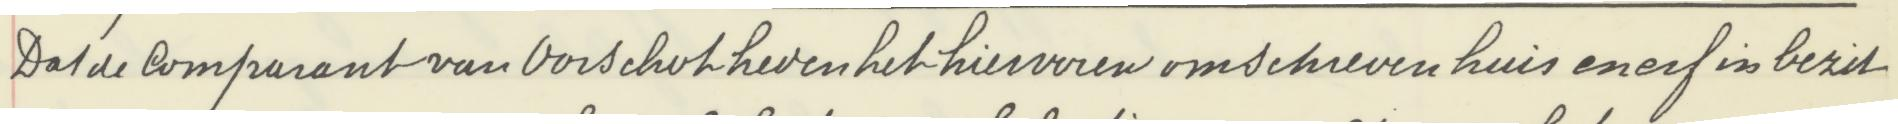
dat de Comparant van Oorschot heden het hiervoren omschreven huis en erf in bezit
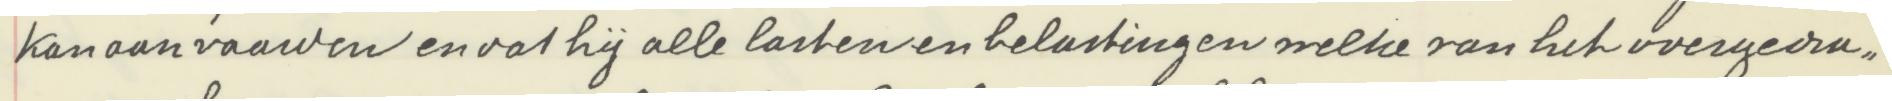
kan aan vaarden en dat hij alle lasten en belastingen welke van het overgedra„
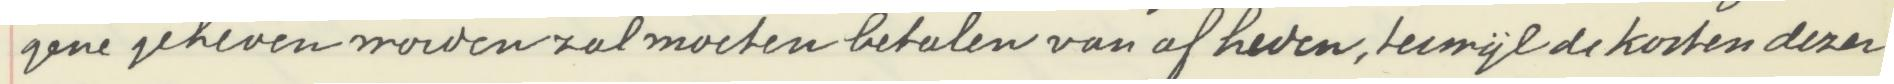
gene geheven worden zal moeten betalen van af heden, terwijl de kosten dezer
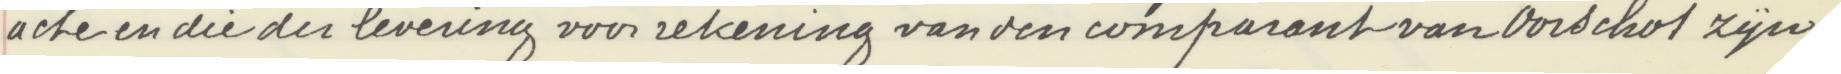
acte en die der levering voor rekening van den comparant van Oorschot zijn.
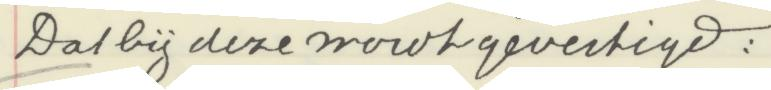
Dat bij deze wordt gevestigd:
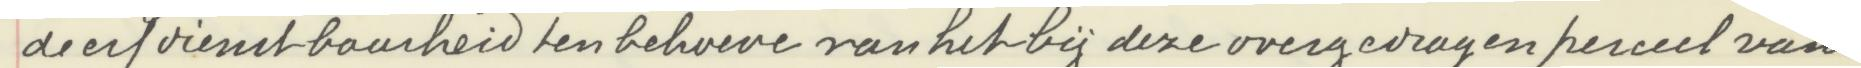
de erfdienstbaarheid ten behoeve van het bij deze overgedragen perceel van
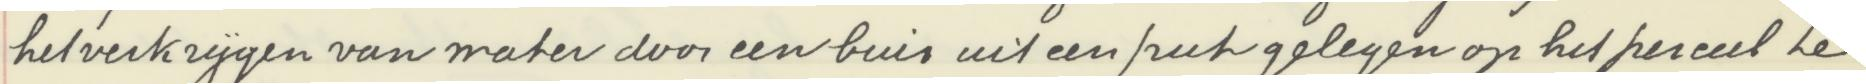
het verkrijgen van water door een buis uit een put gelegen op het perceel te
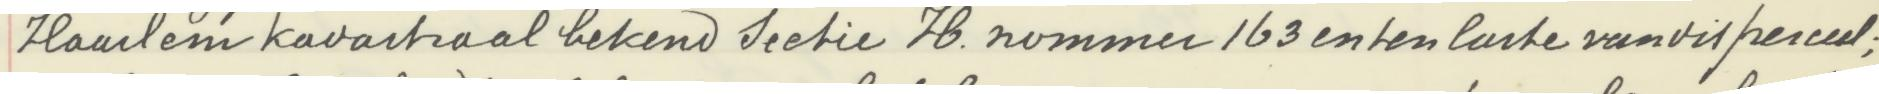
Haarlem kadastraal bekend sectie H. nommer 163 en ten laste van dit perceel;
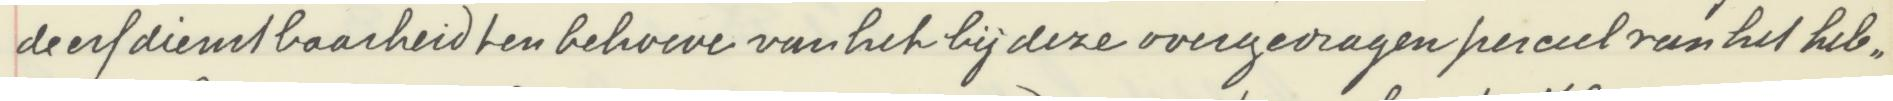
de erfdienstbaarheid ten behoeve van het bij deze overgedragen perceel van het heb„
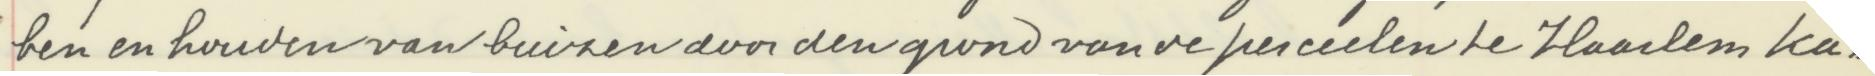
ben en houden van buizen door den grond van de perceelen te Haarlem ka„
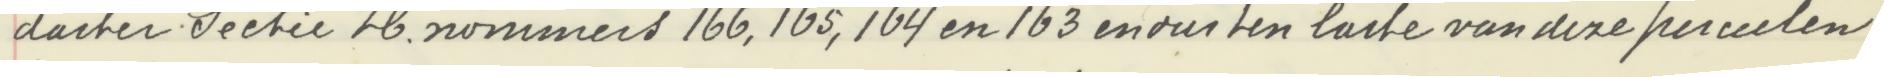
daster sectie H. nommers 166, 165, 167 en 163 en dus ten laste van deze perceelen
